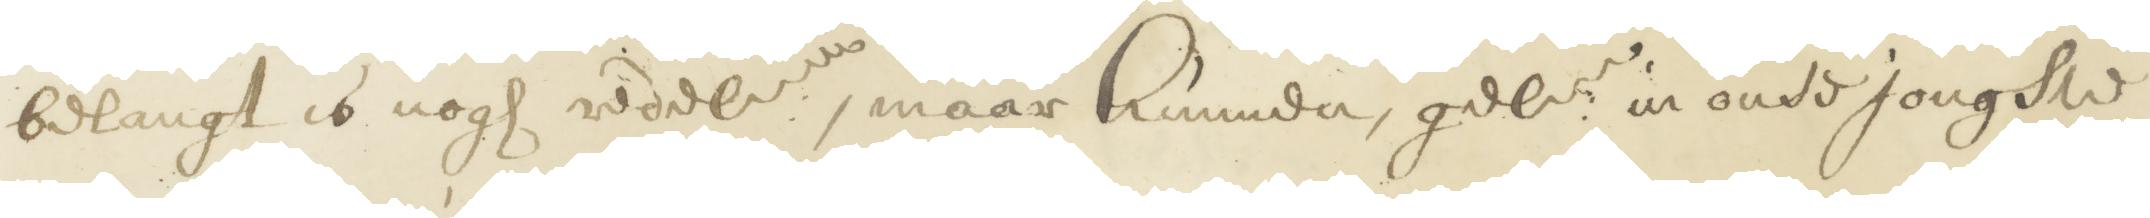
belangt is nogh redel, maar kunnen, gelijk in onse jongste
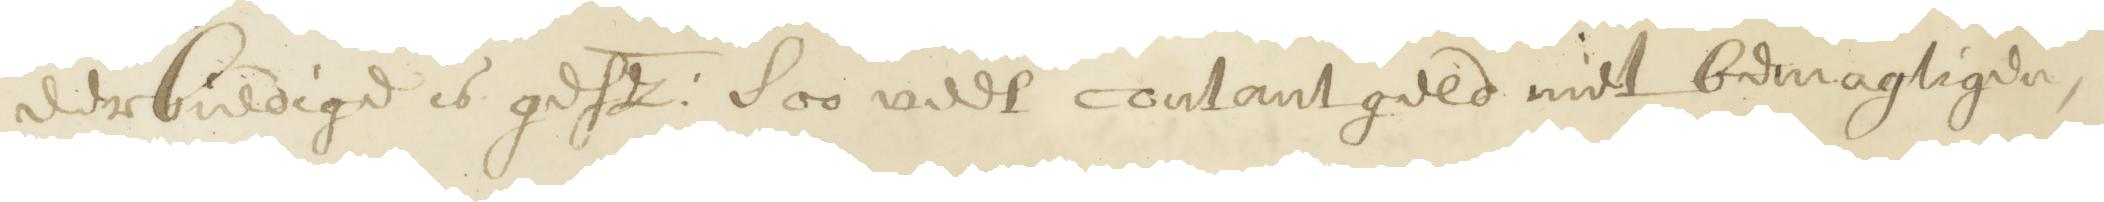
eerbiedige is gesz: Soo veel contant geld niet bemagtigen,
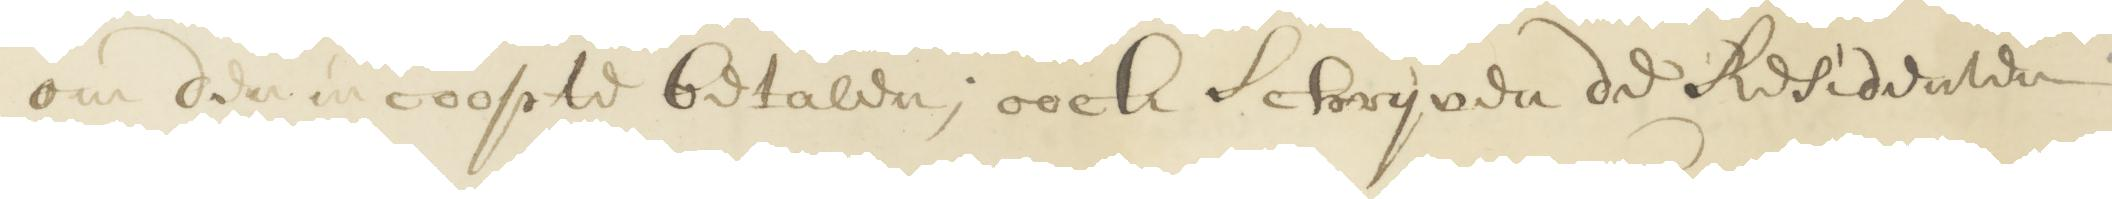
om den incoop te betalen; oock Schrijven de Residenten
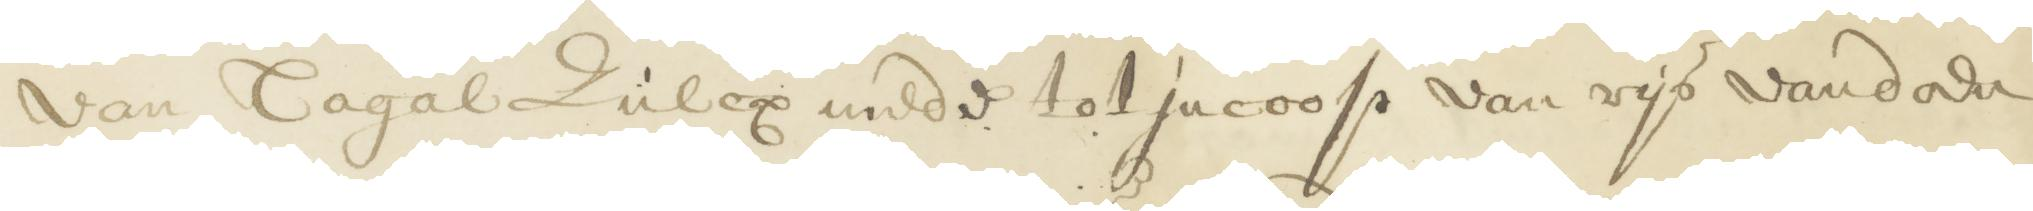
van Tagal Zulcx mede tot jncoop van rijs van doen
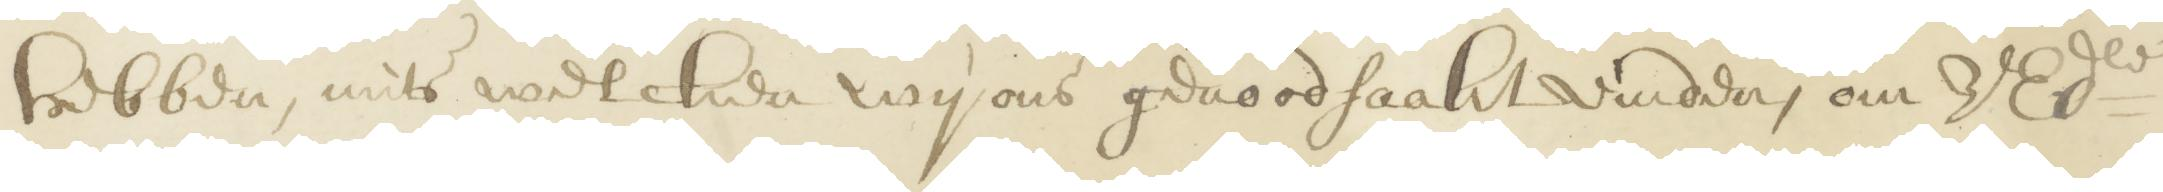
hebben, mits welcken wij ons genoodsaakt vinden, om VEd=le
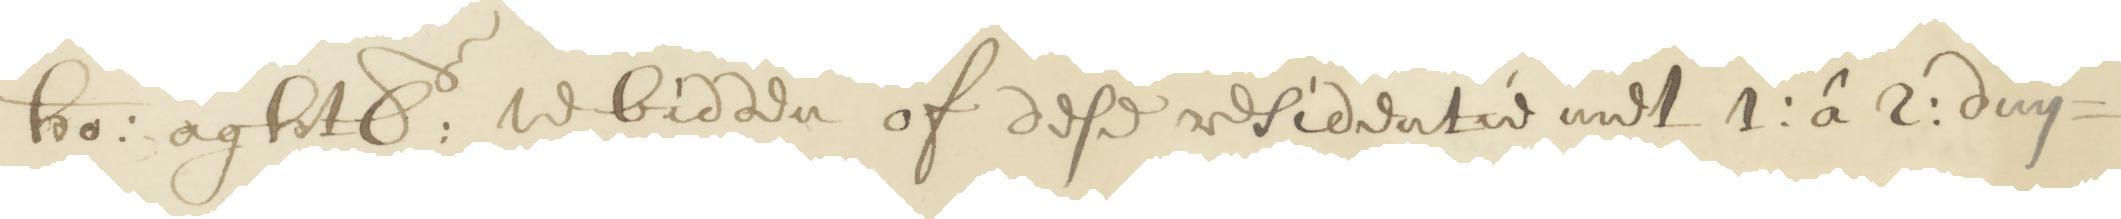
ho: aghtb: te bidden of dese residentie met 1: â 2: duij=
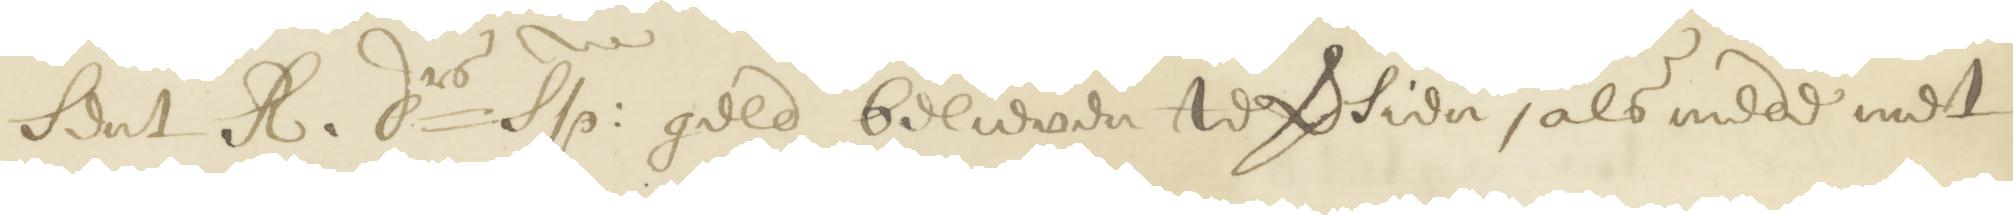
Sent R. d=rs Sp: geld believen te versien, als mede met
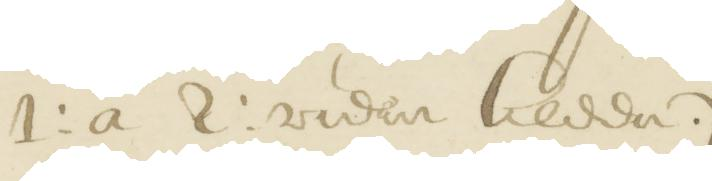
1: â 2: riem kleen.
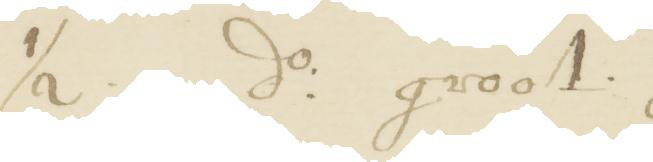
½. d:o groot
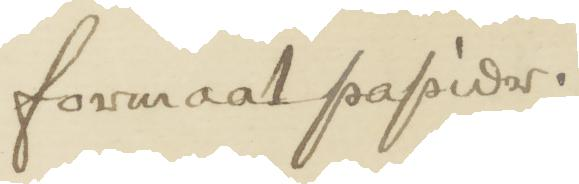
formaat papier.
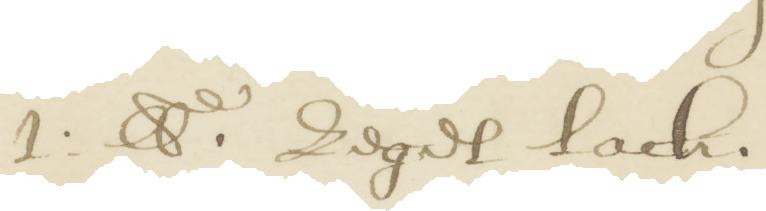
1: lb. zegel lack.
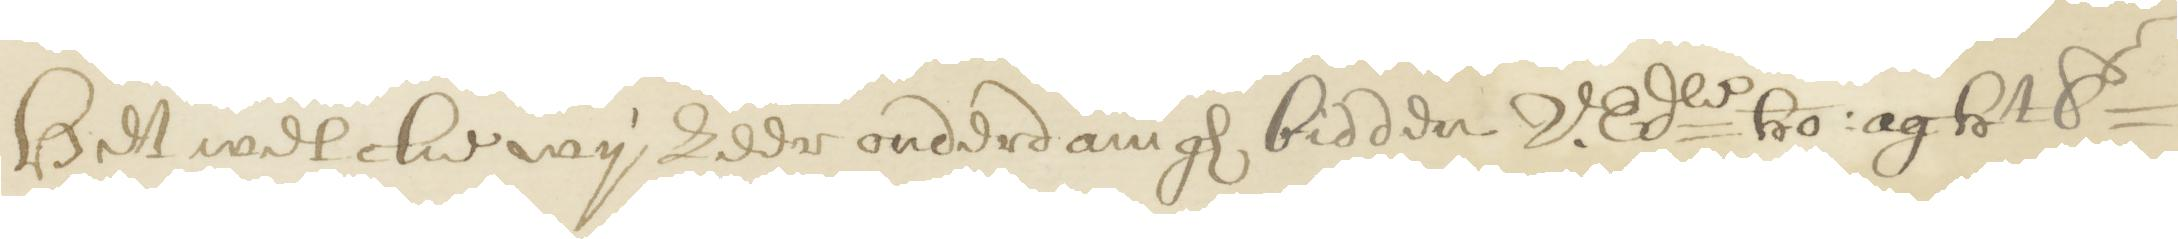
het welcke wij Zeer onderdanigh bidden V. Ed=le ho: aghtb=s
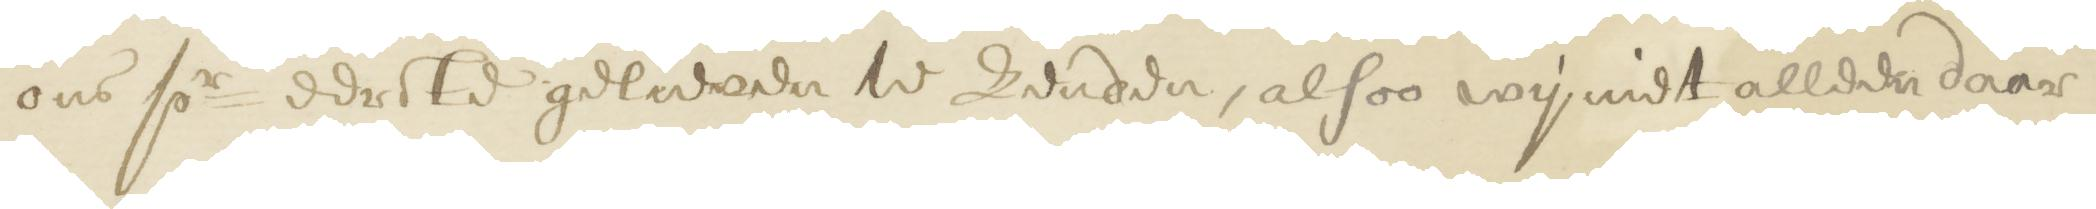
ons p=r eerste gelieven te Zenden, alsoo wij niet alleen daar
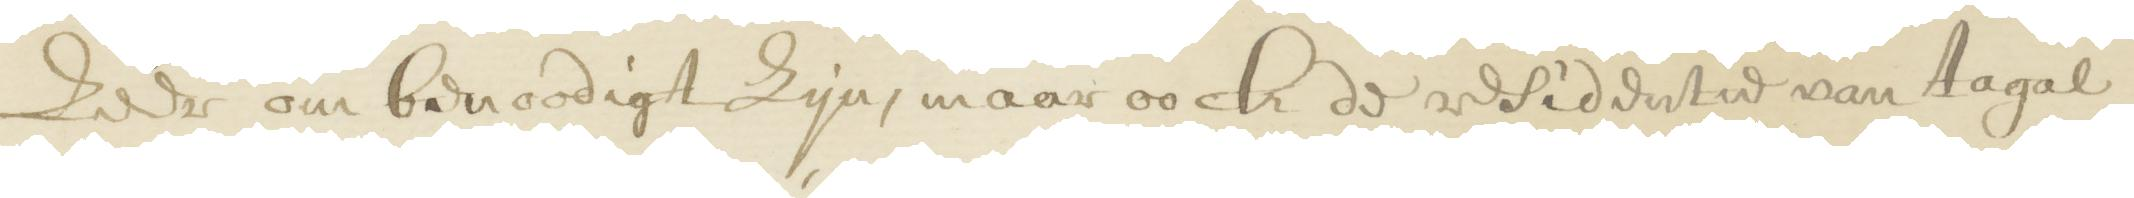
Zeer om benoodigt Zijn, maar oock de residentie van tagal
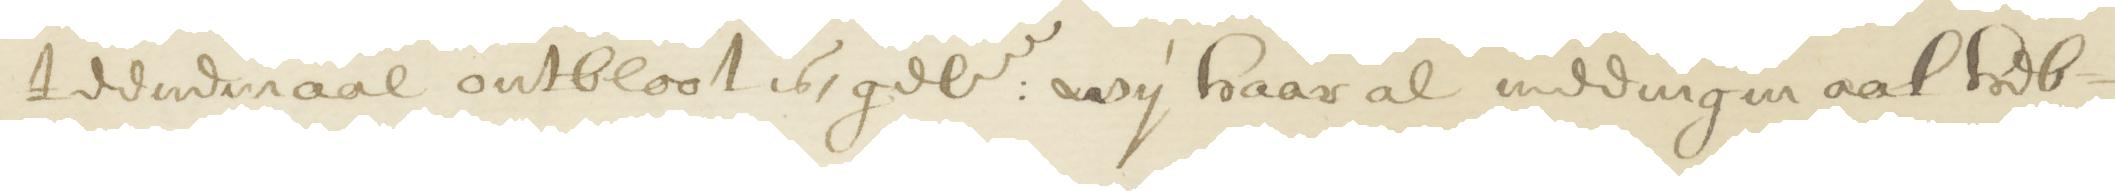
t eenemaal ontbloot is, gelijk wij haar al meenigmaal heb=
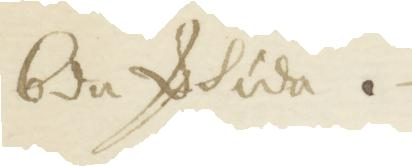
ben versien.
